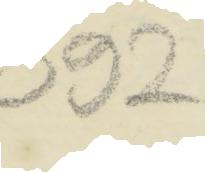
392
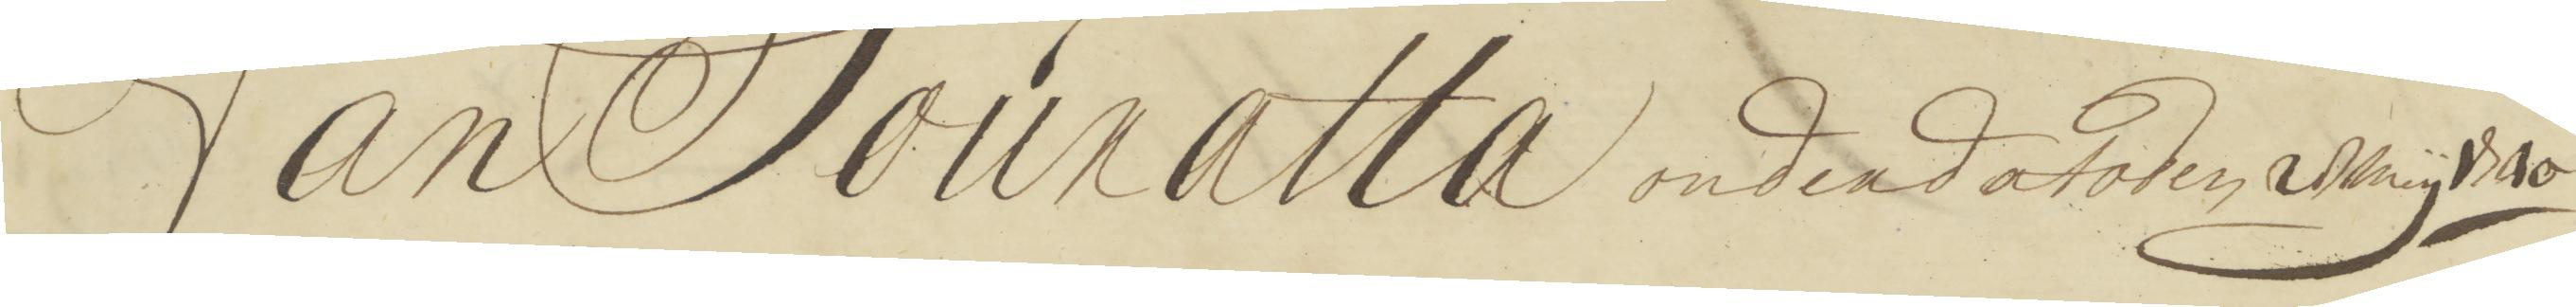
Van Souratta onderdatoden 28 meij 1740
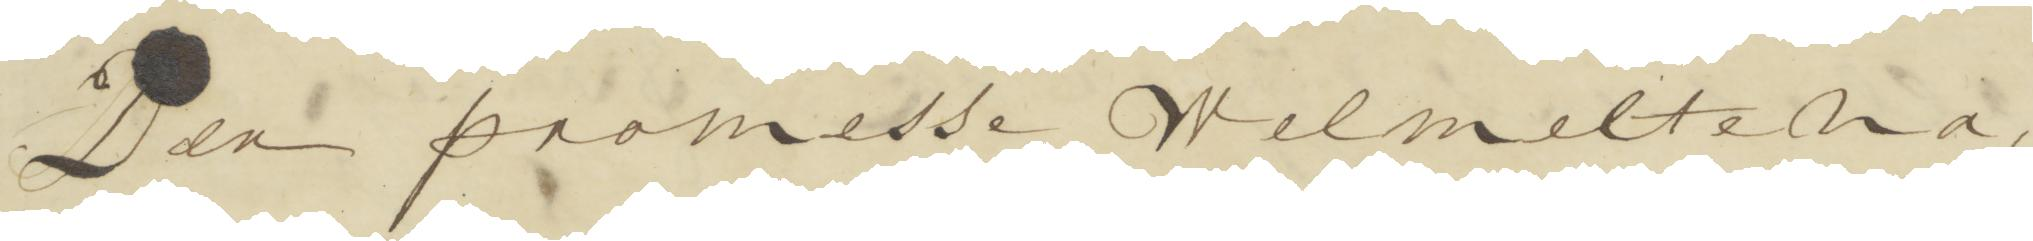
Der promesse welmelte na„
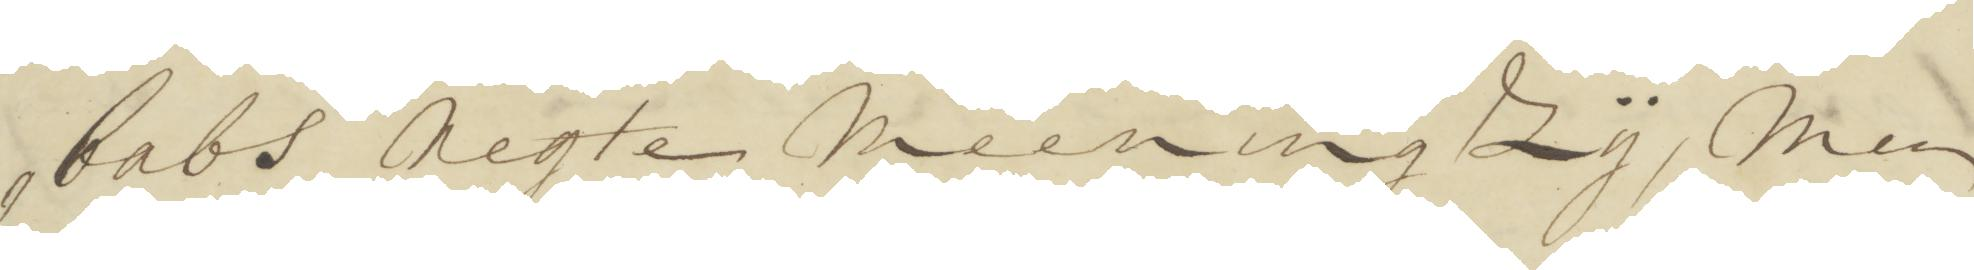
„babs Regte Meening zij, Men
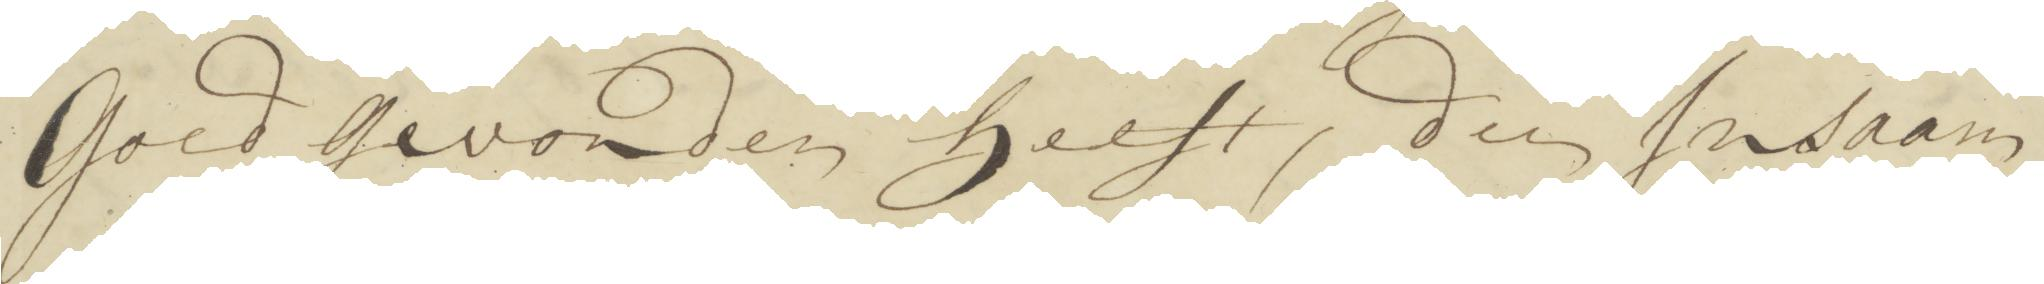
Goed gevonden heeft, die Jnsaam
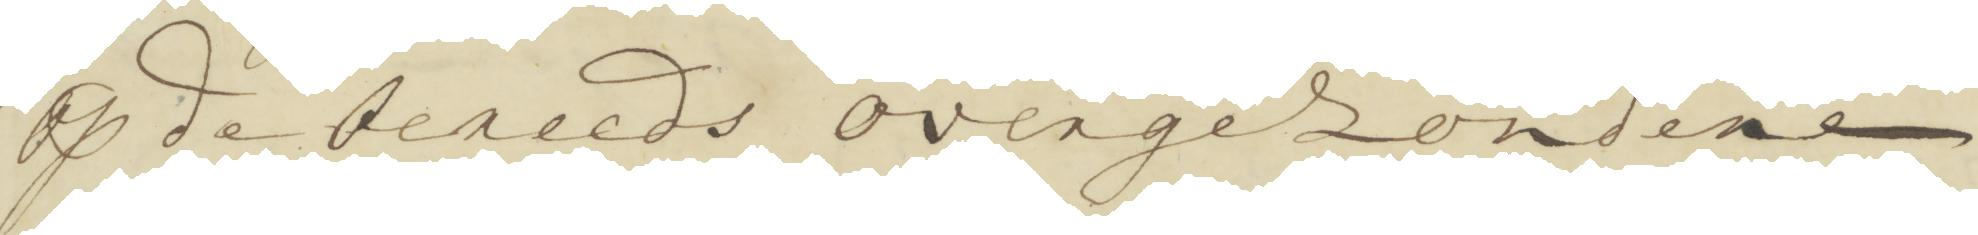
op de bereeds overgezondene
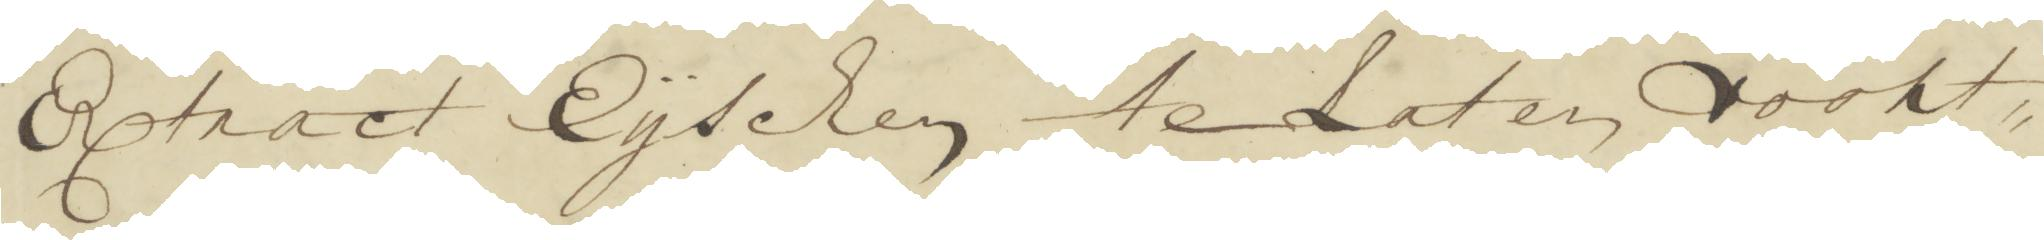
Extract Eijschen te Laten Voort„
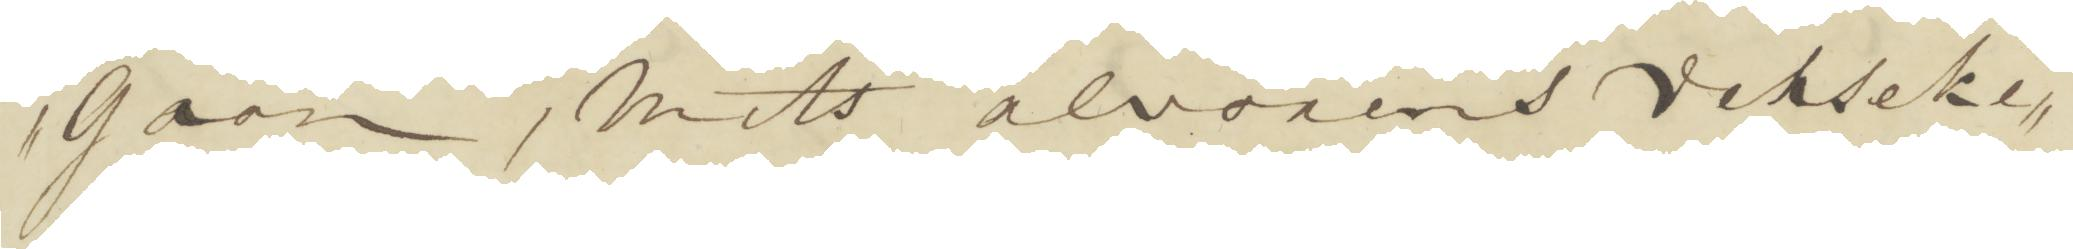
„Gaan, Mits alvorens Verseke„
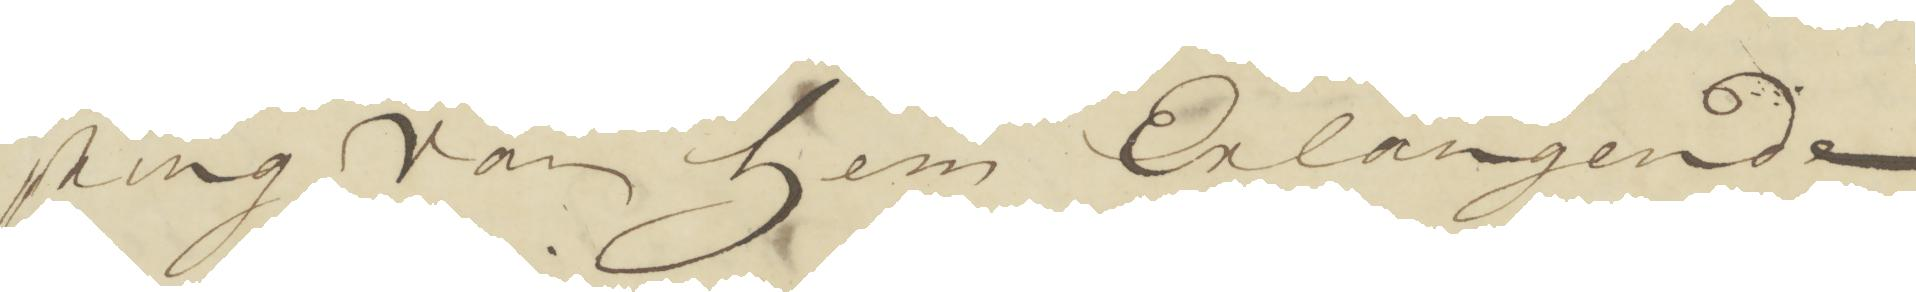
„Ring van Hem Erlangende
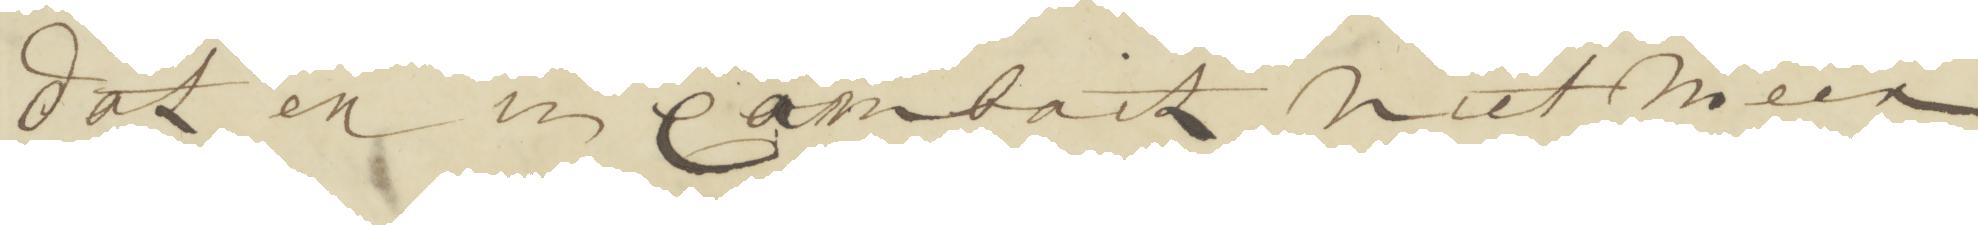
dat 'er in Cambait niet Meer
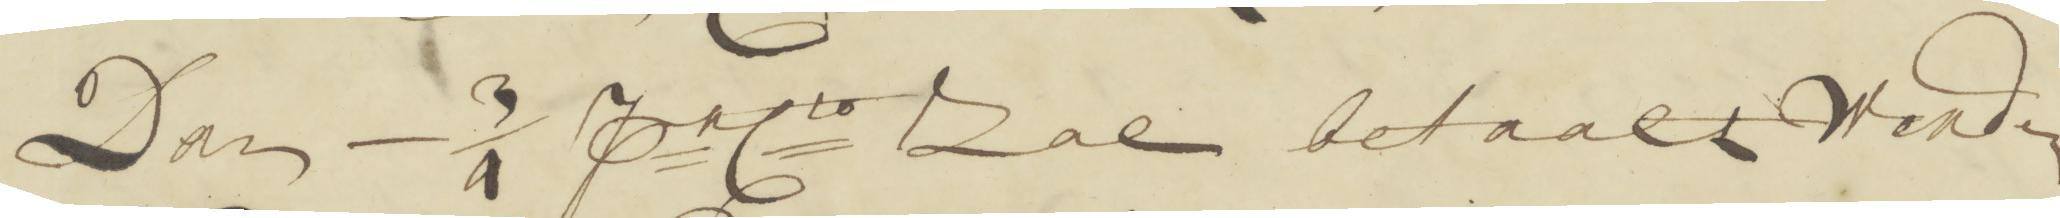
Dan — ¾ p=rC=to betaalt Werden
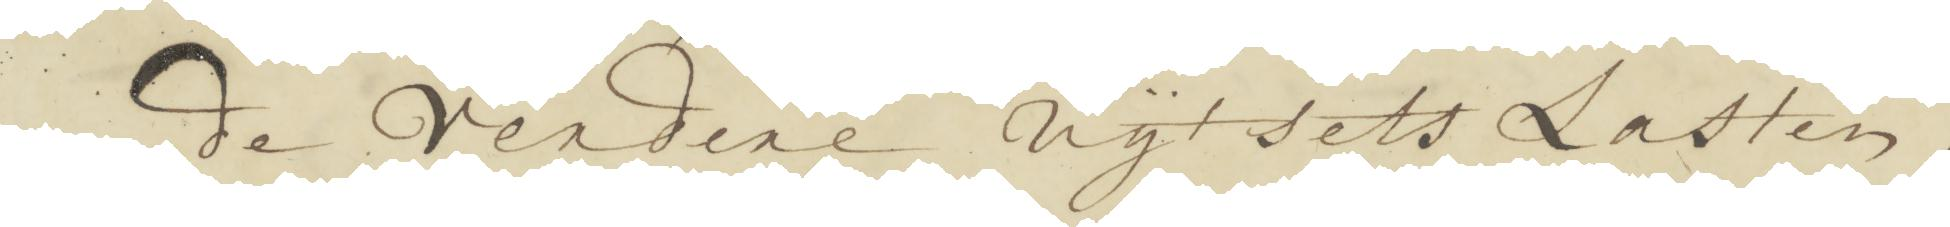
en de Verdere uijtsets Lasten,
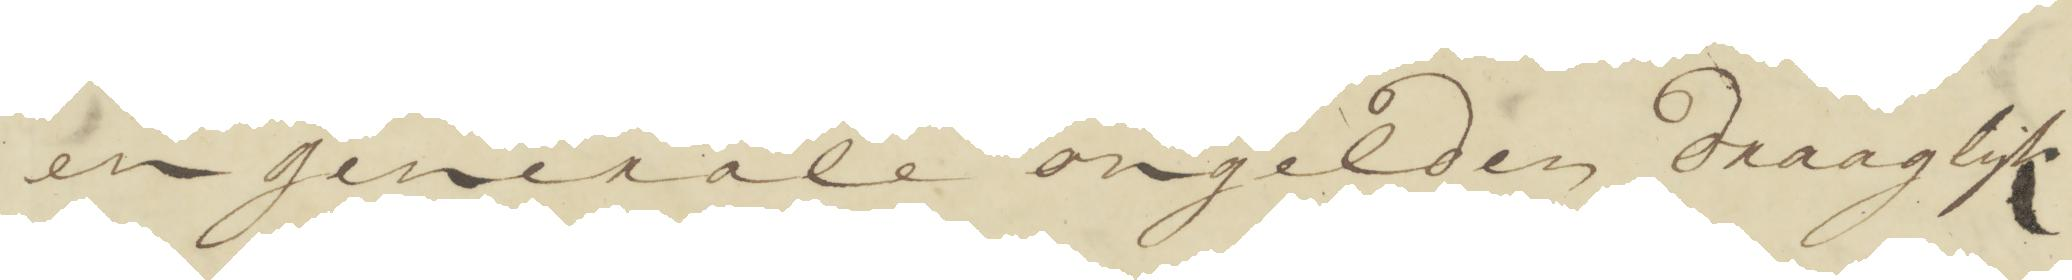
en generale ongelden draaglijk
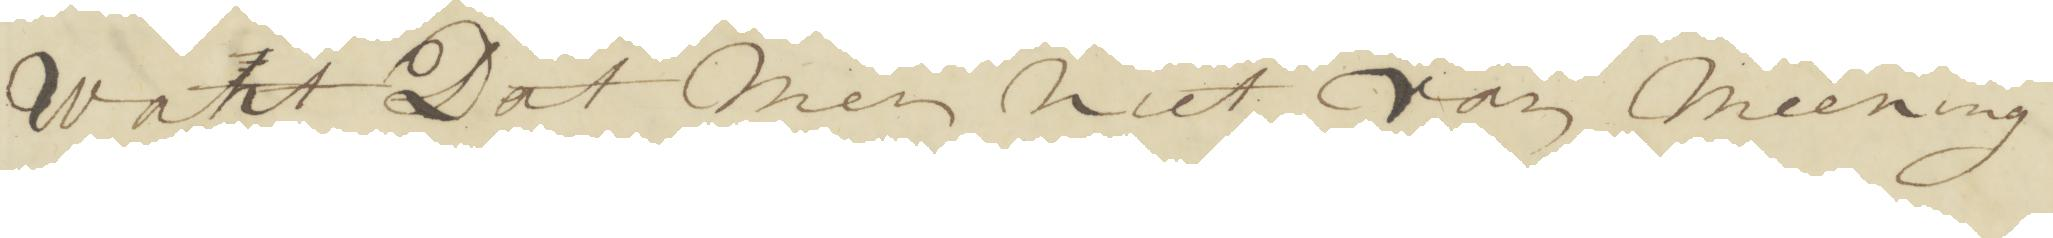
Want Dat Men Niet Van Meening
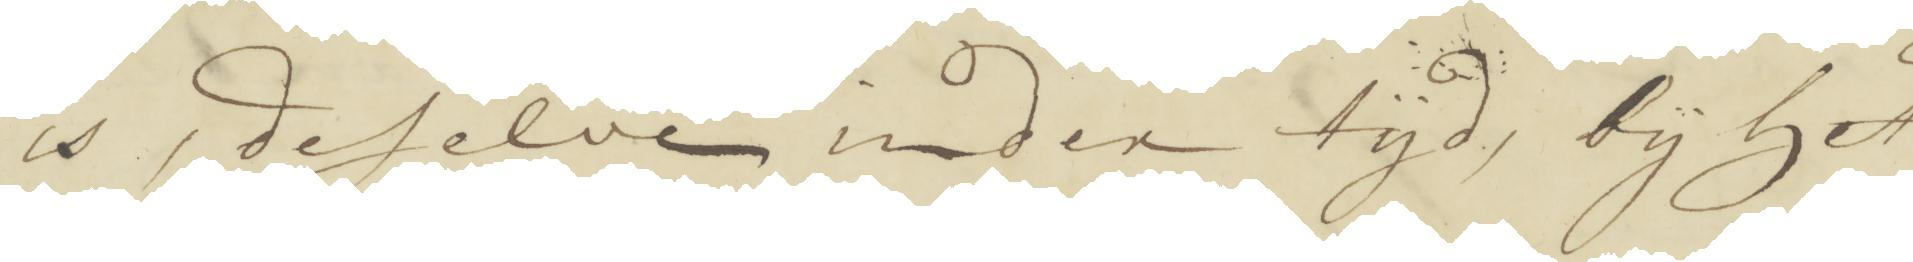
is, deselve in der tijd, bij het
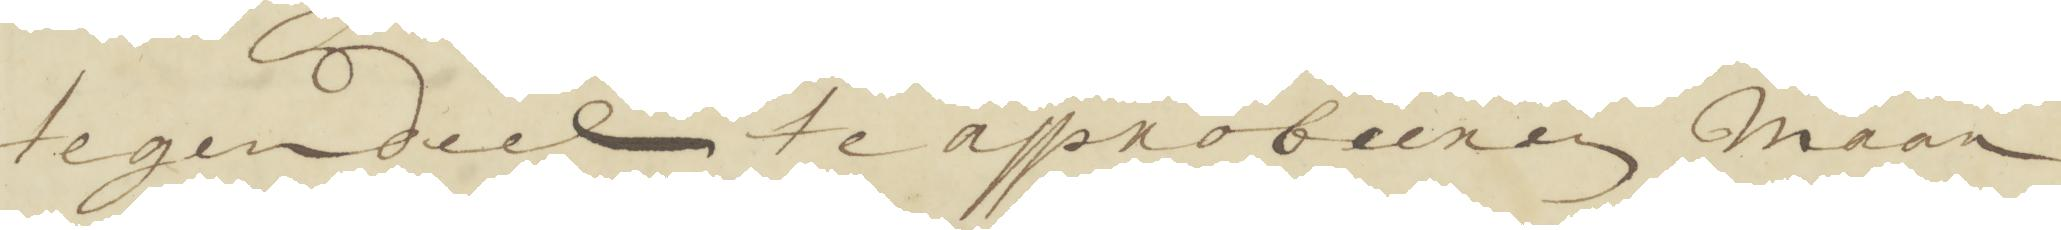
tegendeel te approbeeren Maar
